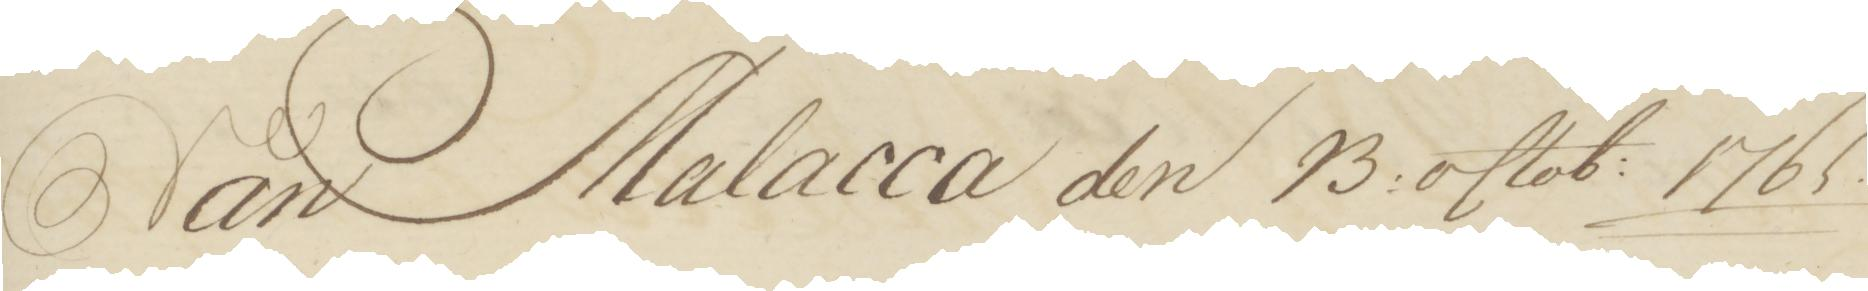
Van Malacca den 13: octob: 1765.
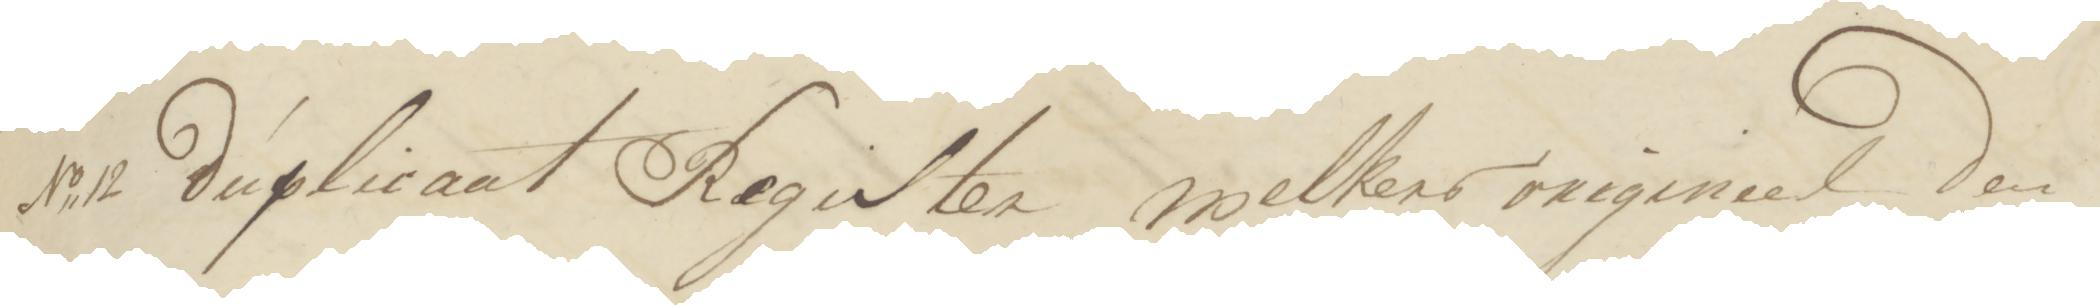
N„o 12 duplicaat Register welkers origineel den
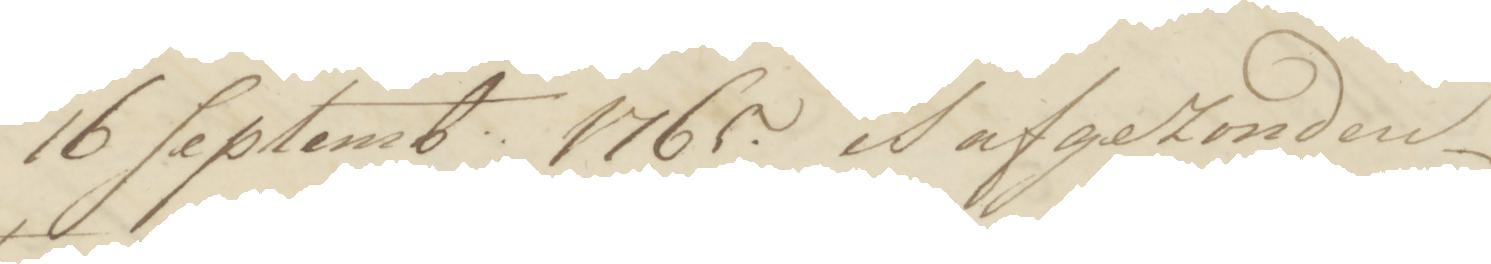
16 septemb: 1765. is afgezonden
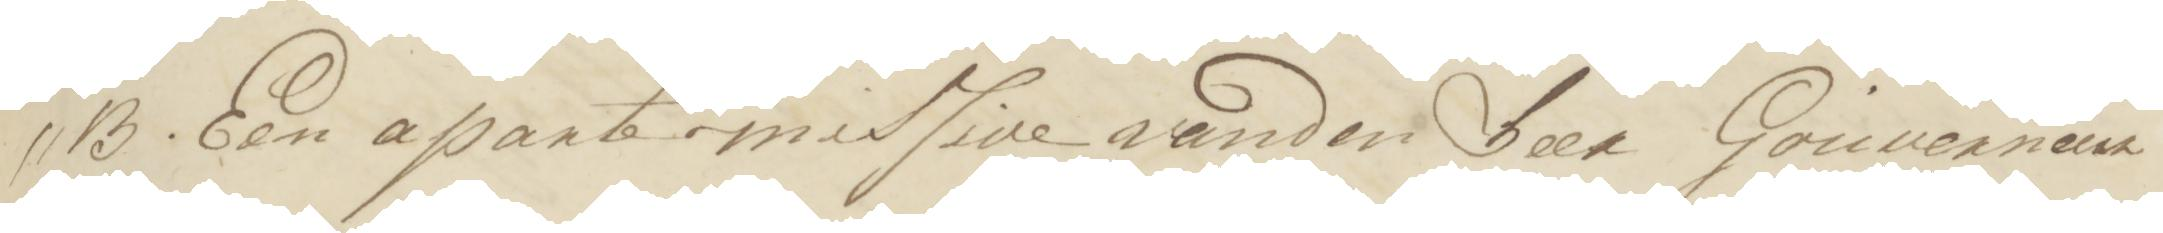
„ 13. Een aparte missive vanden heer Gouverneur
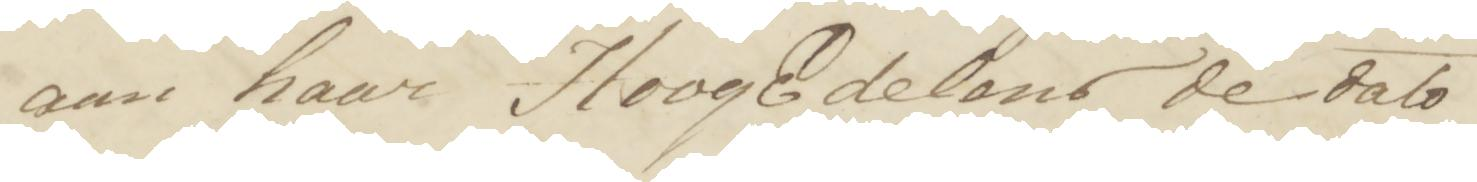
aan haar Hoog Edelens de dato
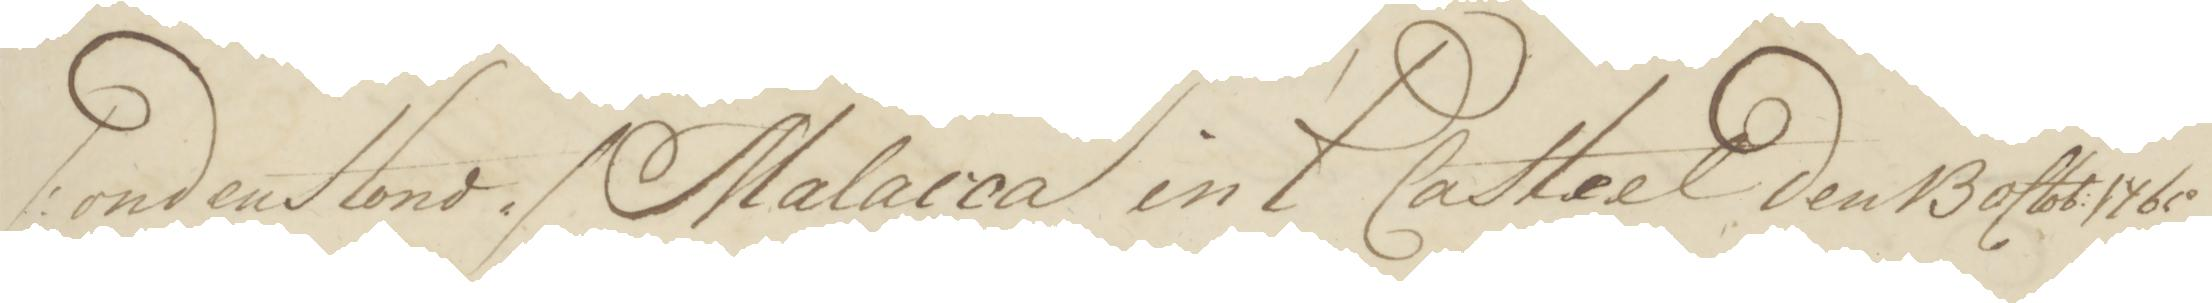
/onderstond:/ Malacca in ’t Casteel den 13 Octob: 1765
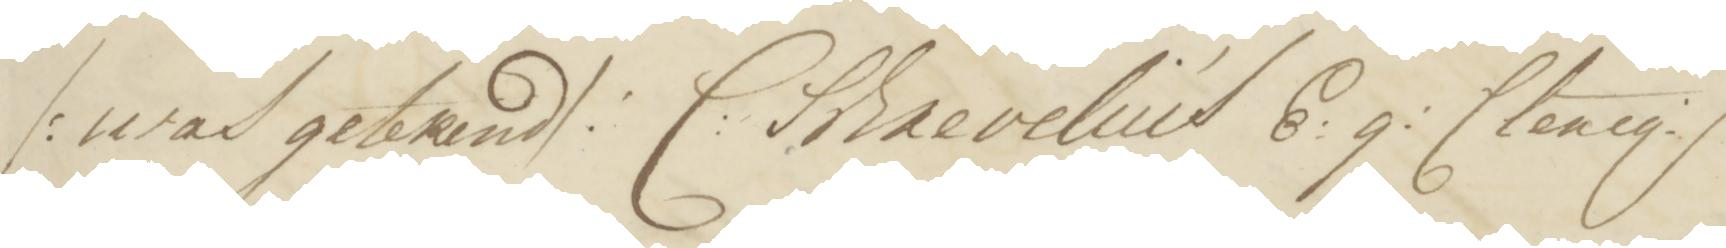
/:was getekend/: C: Schrevelius E:q: Clercq:/
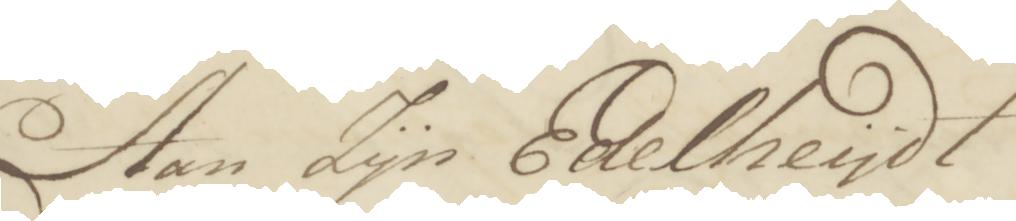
Aan zijn Edelheijdt
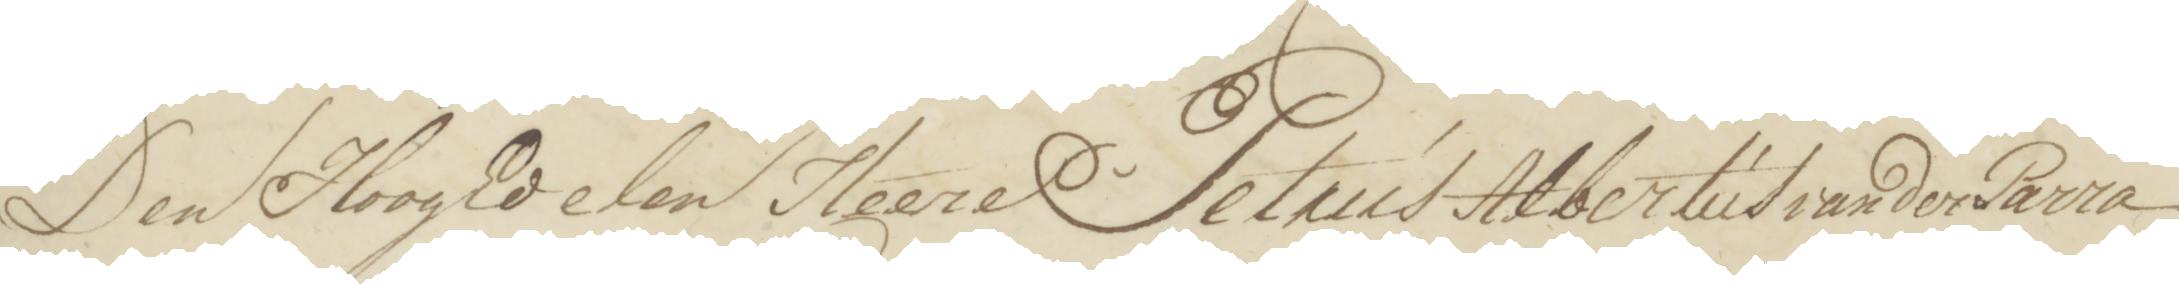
Den Hoog Edelen Heere Petrus Albertus van der Parra
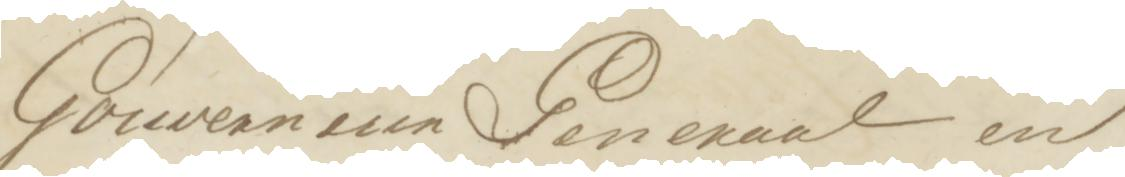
Gouverneur Generaal en
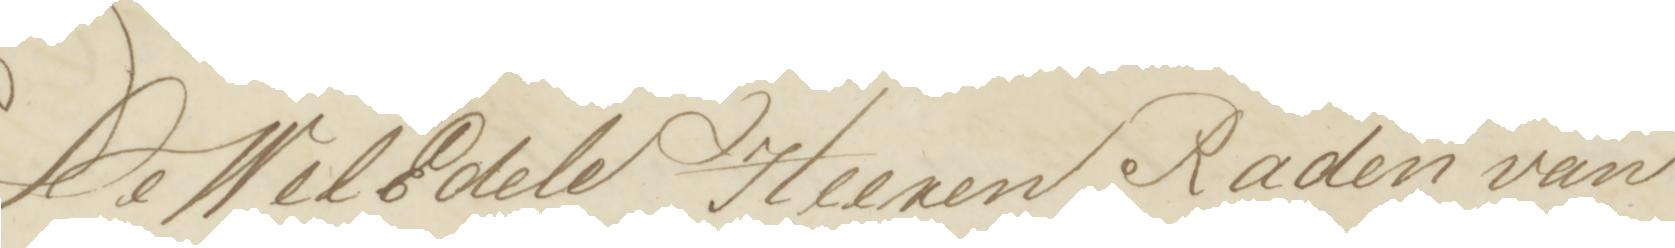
De Wel Edele Heeren Raden van
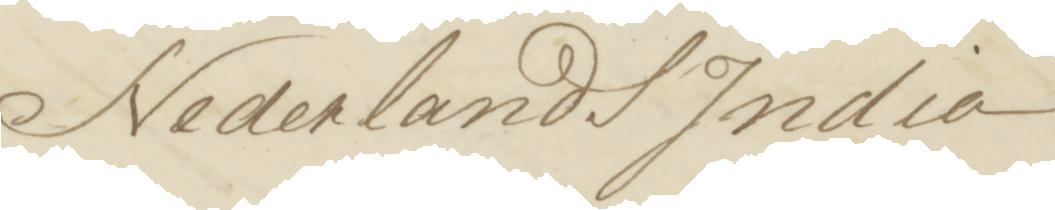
Nederlands Jndia
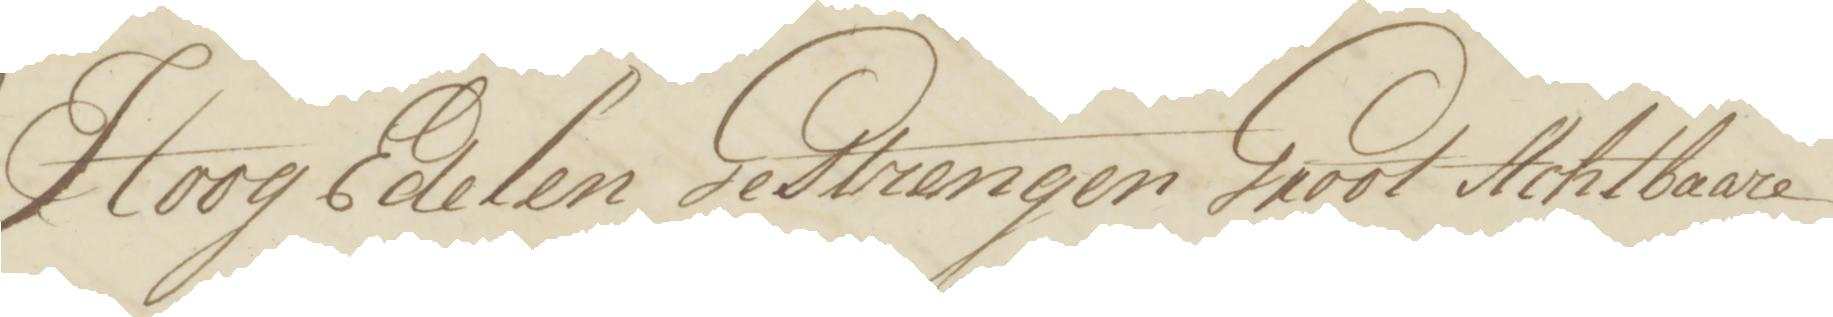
Hoog Edelen Gestrengen Groot Achtbaare
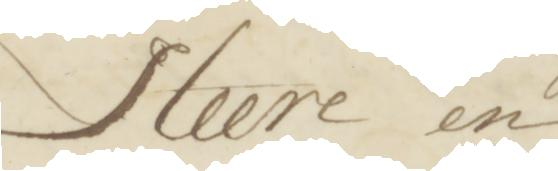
Heere en
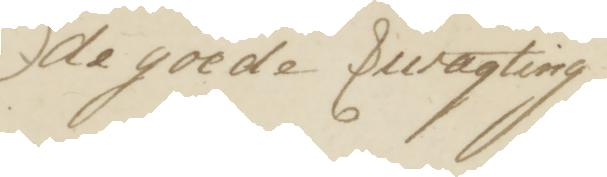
de goede verwagting
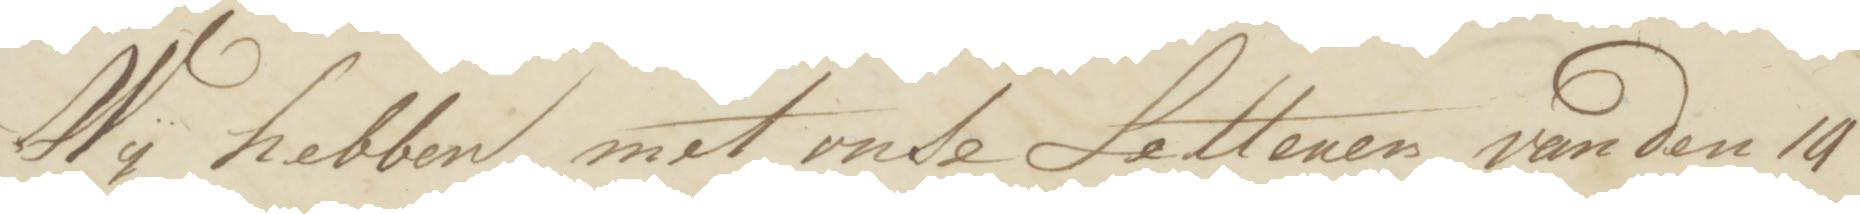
Wij hebben met onse Letteren van den 14
